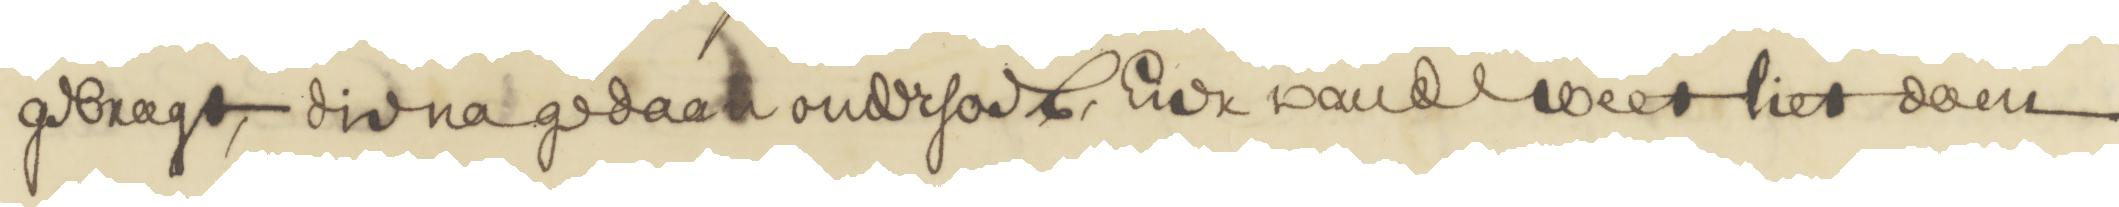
gebragt, die na gedaan ondersoek, hier van de weet liet doen
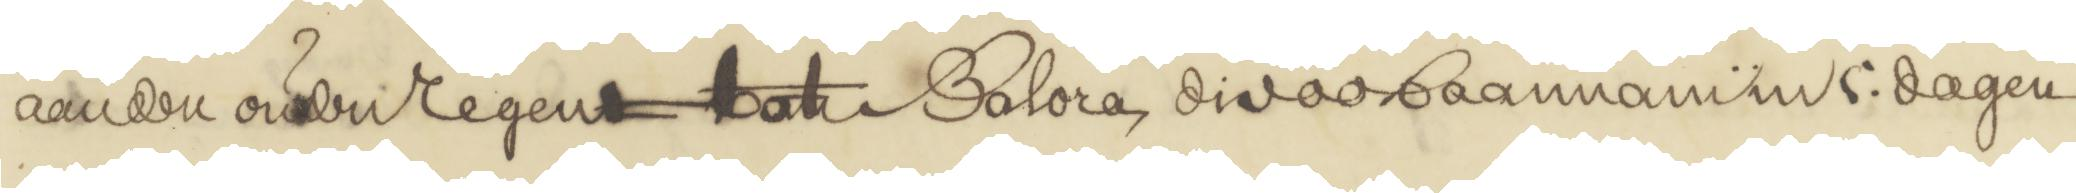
aan den ouden regent tot Balora die ook aannam in 5. dagen
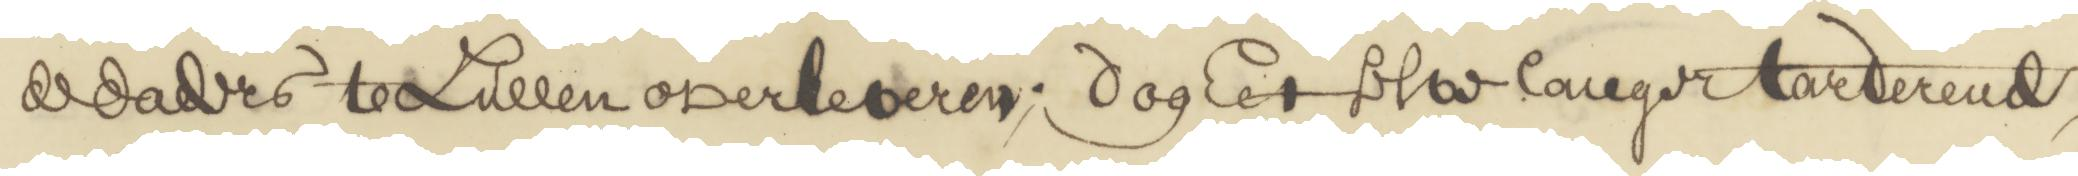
de daders te zullen overleveren; dog het selve langer tarderende,
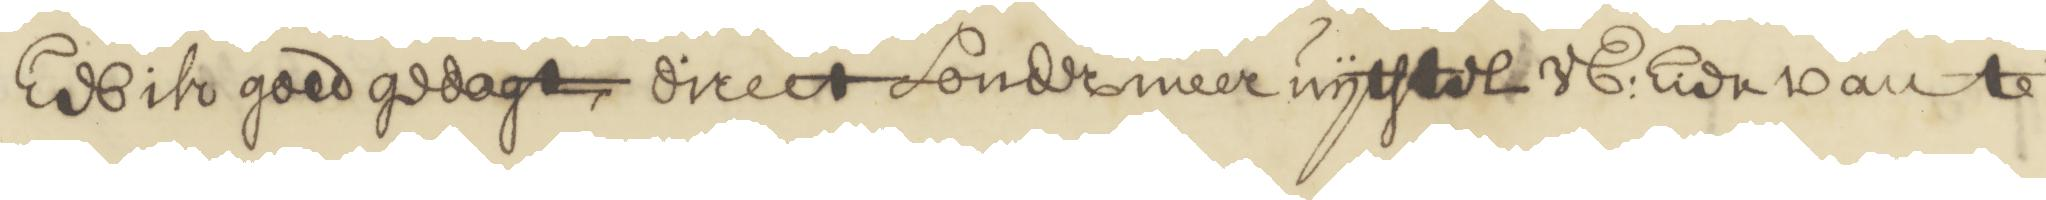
heb ik goed gedagt, direct sonder meer uijtstel VE: hier van te
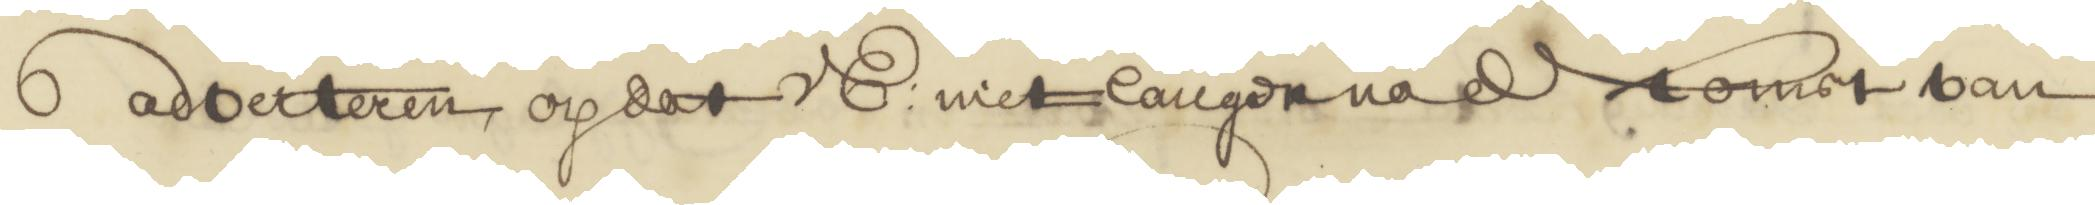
adverteren, opdat VE: niet langer na de comst van
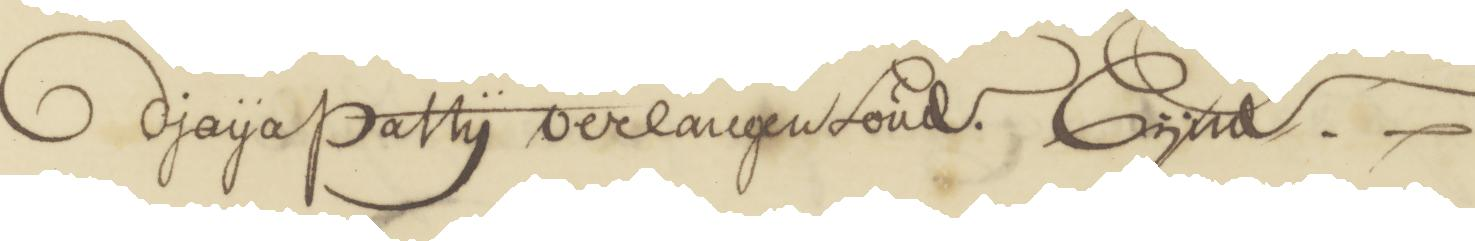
djaija pattij verlangen soude. Eijnde. —
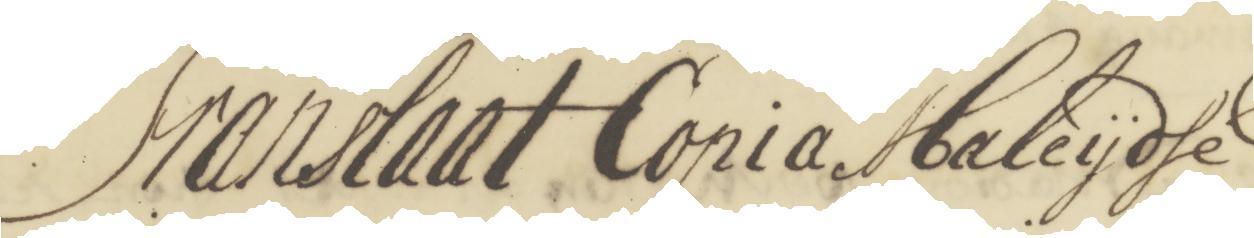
Translaat Copia Maleijdse
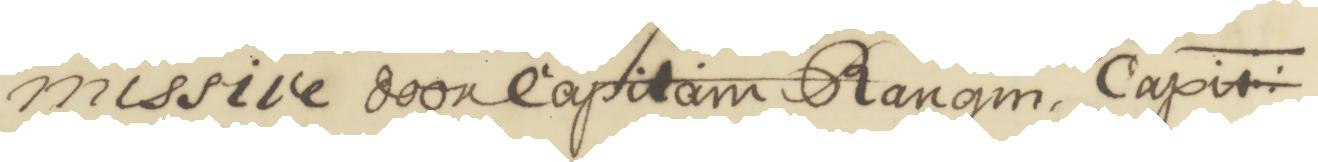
missive door Capitain Rangin, Capit:
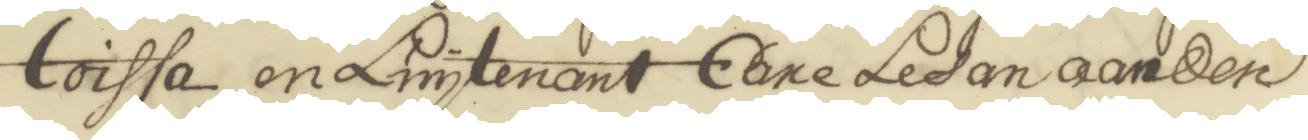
toissa, en Luijtenant Care Lesan aan den
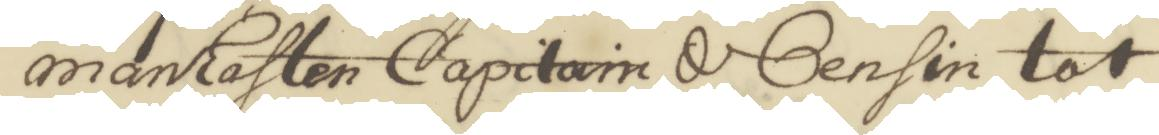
manhaften Capitain de Bensin tot
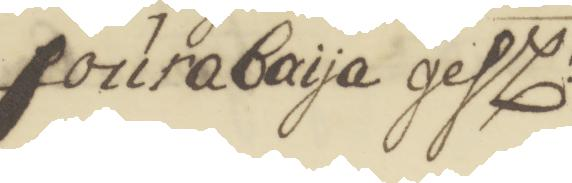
jourabaija gesz
